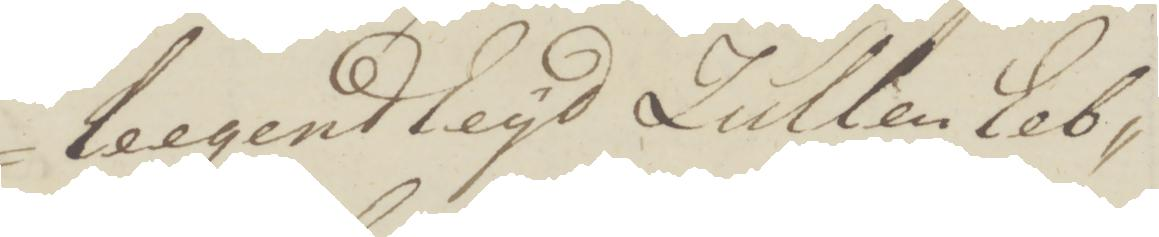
„leegendheijd zullen heb„
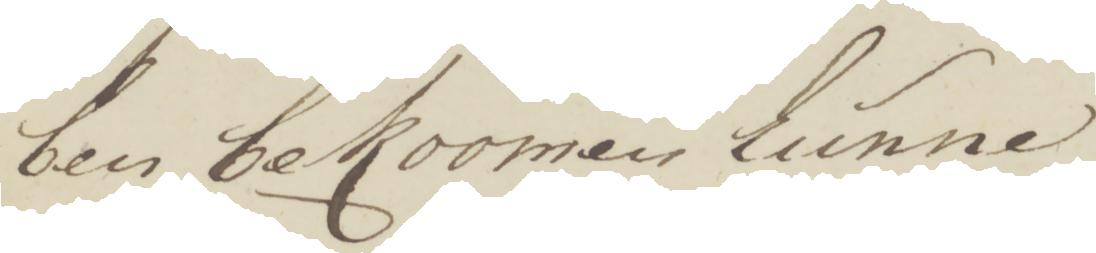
ben bekoomen hunne
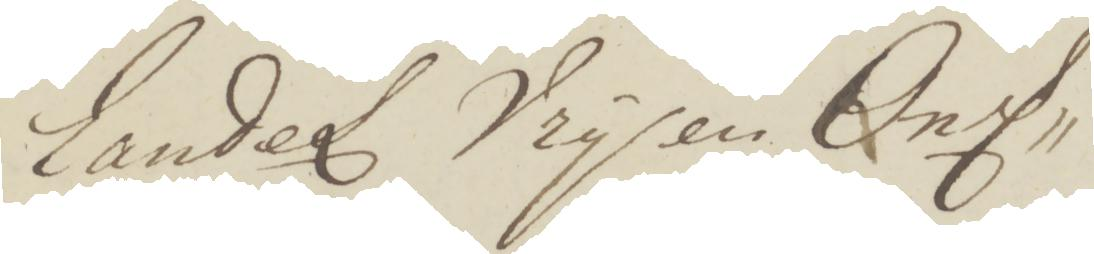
handel vrij en Onver„
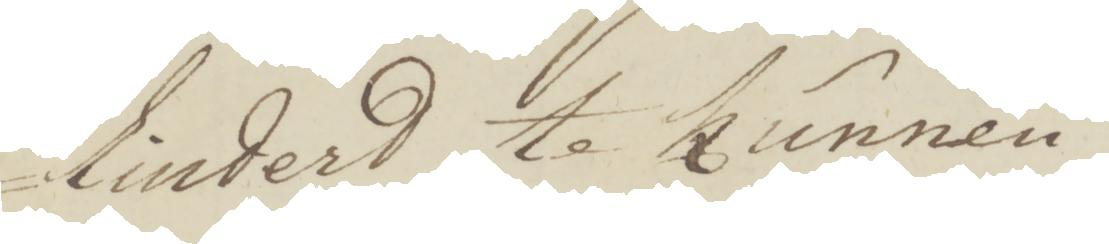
„hinderd te kunnen
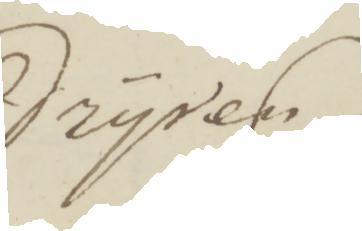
drijven
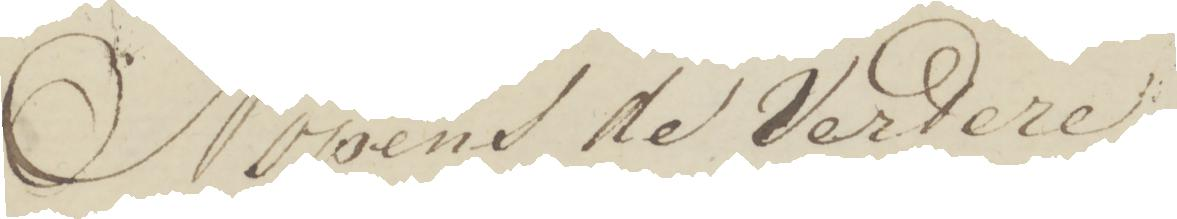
Nopens te verdere
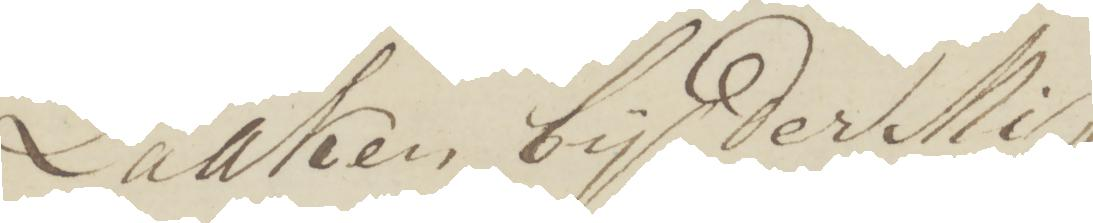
zaaken bij der Mi
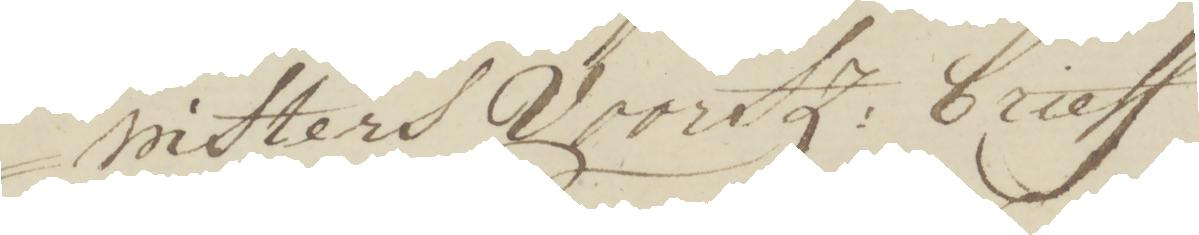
„nisters voorsz: brieff
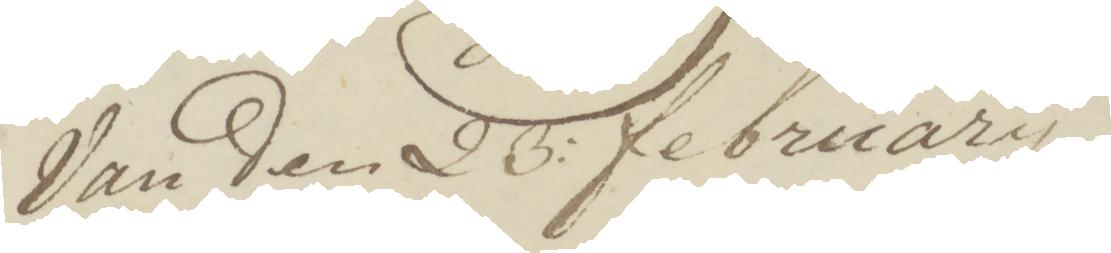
van den 23: februarij
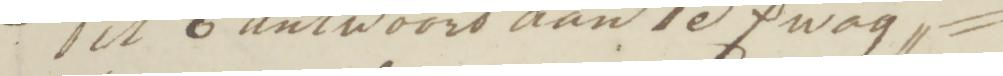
dit b'antwoord aan de verwag„=
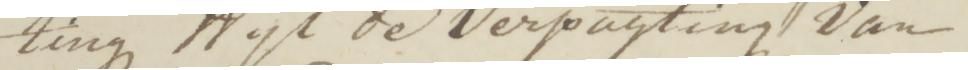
ting, Wijl de verpagting van
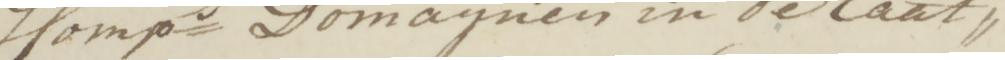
s Comp=s Domaijnen in de laat„
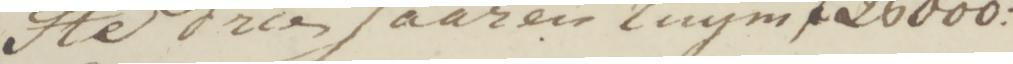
ste drie Jaaren ruijm ƒ 26000:
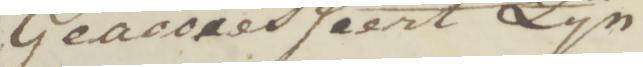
Geacceesseert zijn
